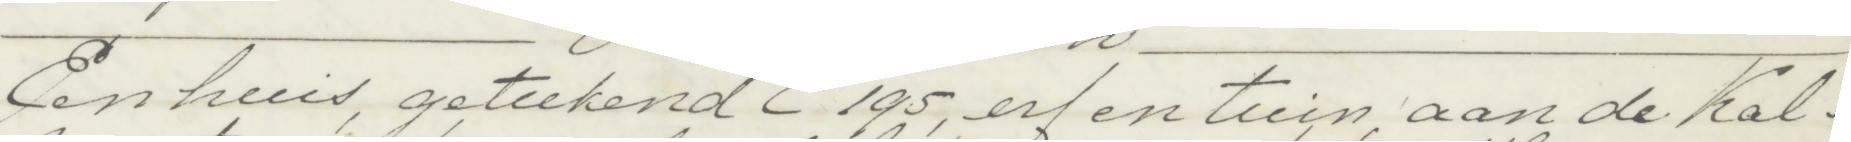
Een huis, geteekend E 195, erf en tuin aan de Kal-
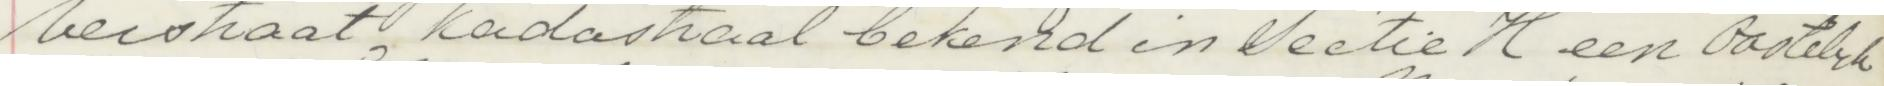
verstraat, kadastraal bekend in sectie H een Oostelyk
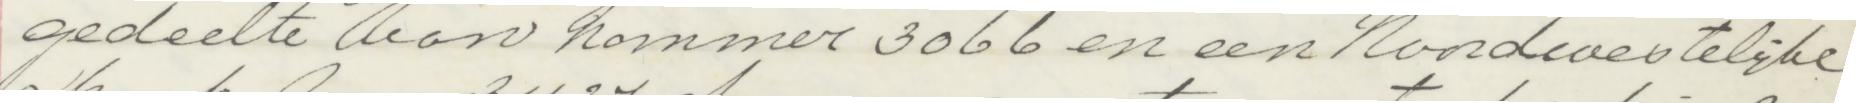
gedeelte van nommer 3066 en een Noordwestelijke
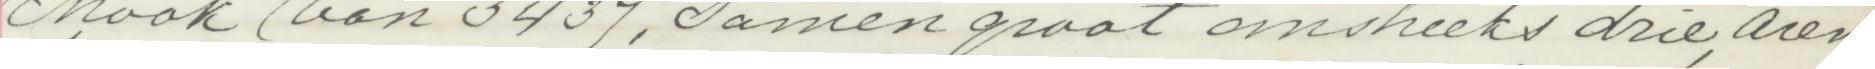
Mook van 3437, samen groot omstreeks drie aren
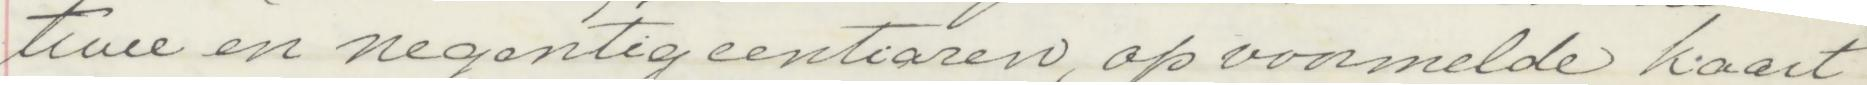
twee en negentig centiaren, op voormelde kaart
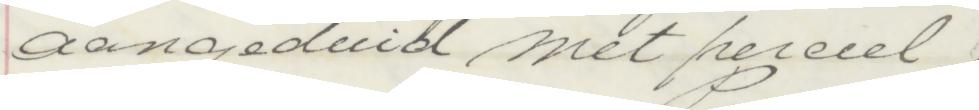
aangeduid met perceel
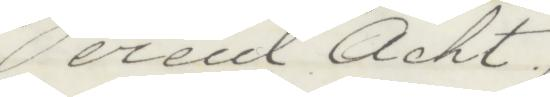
Perceel Acht.
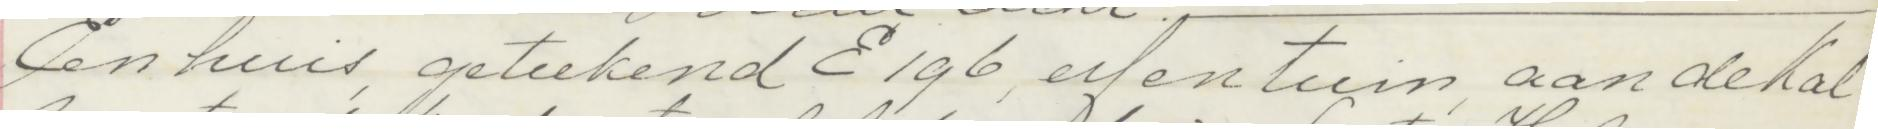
Een huis geteekend E 196, erf en tuin, aan de Kal-
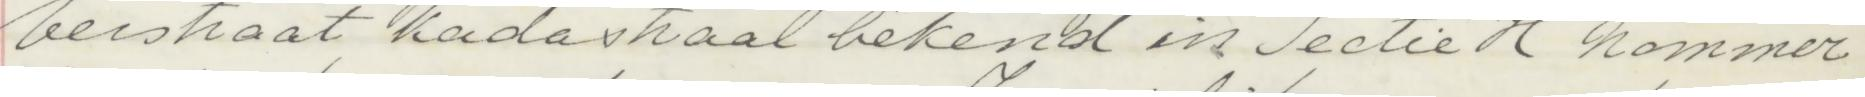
verstraat, kadastraal bekend in sectie H nommer
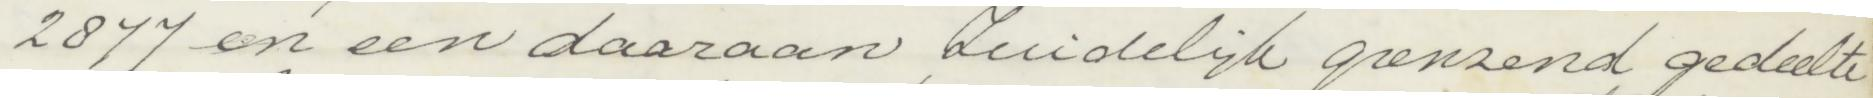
2877 en een daaraan Zuidelijk grenzend gedeelte
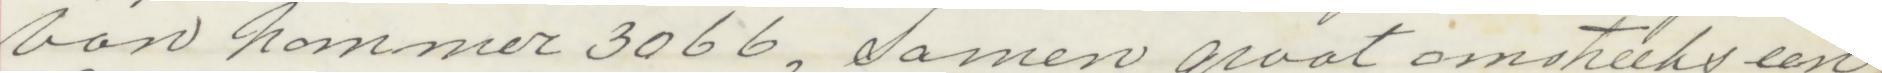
van Nommer 3066, samen groot omstreeks een
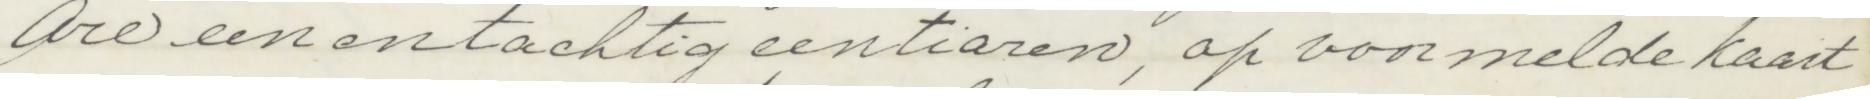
Are een en tachtig centiaren, op voormelde kaart
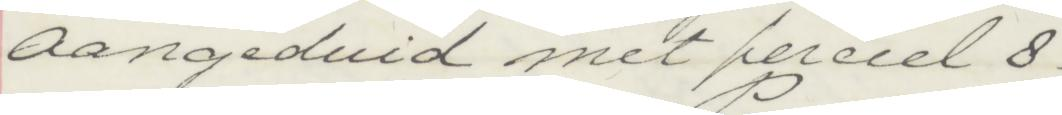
aangeduid met perceel 8
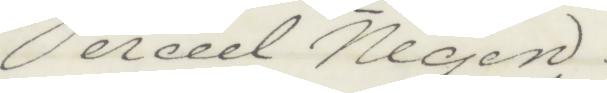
Perceel Negen
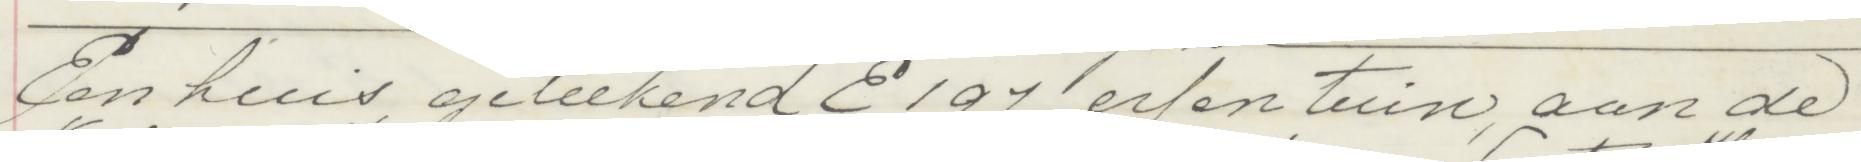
Een huis geteekend E 197, erf en tuin, aan de
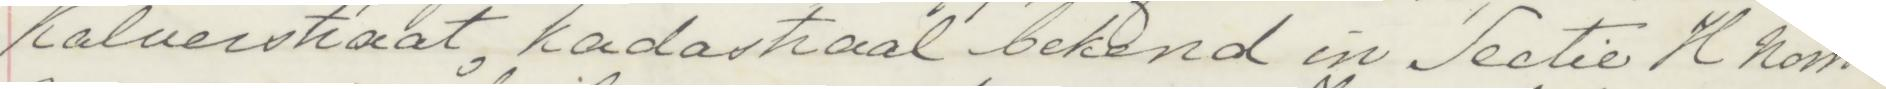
Kalverstraat, kadastaal bekend in sectie H nom-
